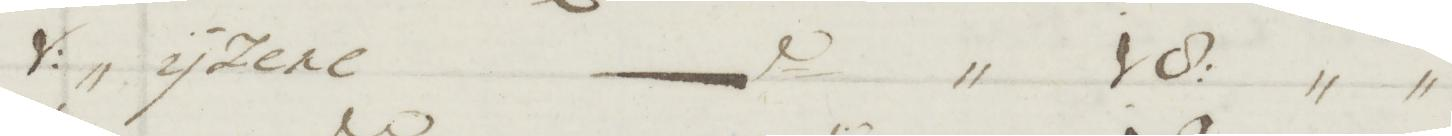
1: „ ijzere _=o „ 18: „ „
